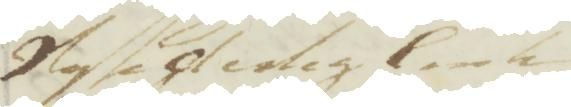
Vijf dertig Cents
